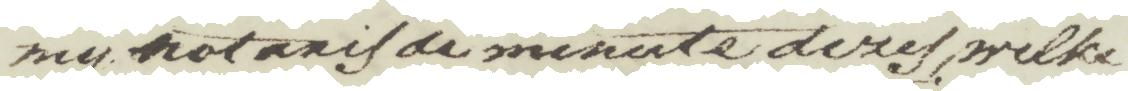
my notaris de minute dezes, welke
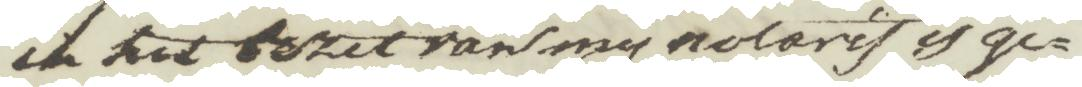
in het bezit van my notaris is ge„
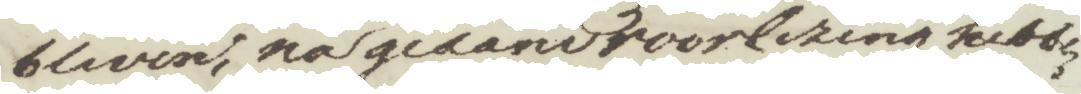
bleven, na gedane voorlezing hebben
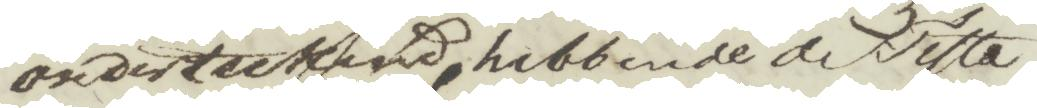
onderteekend, hebbende de Testa
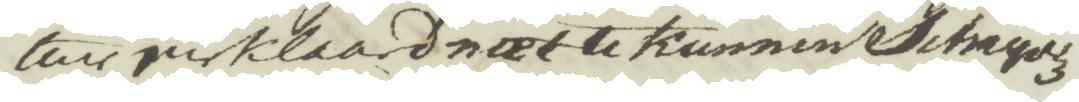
teur verklaard niet te kunnen schryven
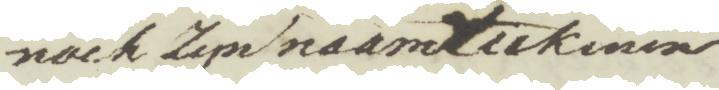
noch zyn naamteekenen
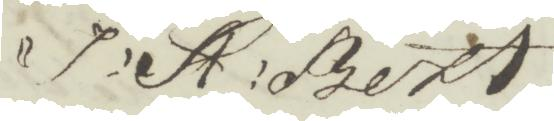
J: A: Berts
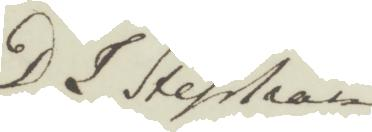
D L Stephan
